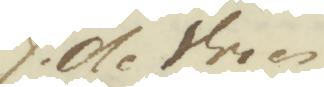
J. de Vries
